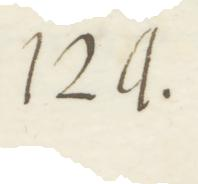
124.
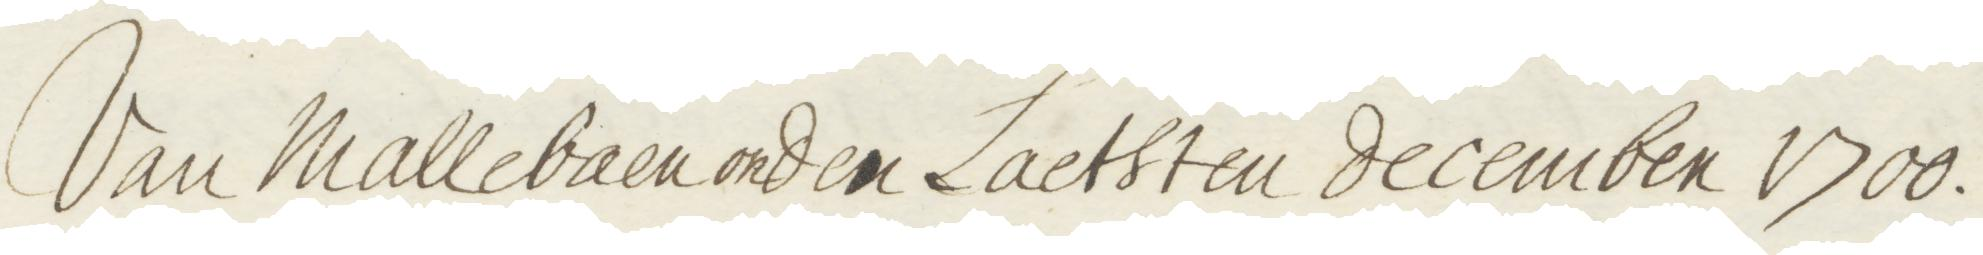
Van Mallebaer onder Laetsten december 1700.
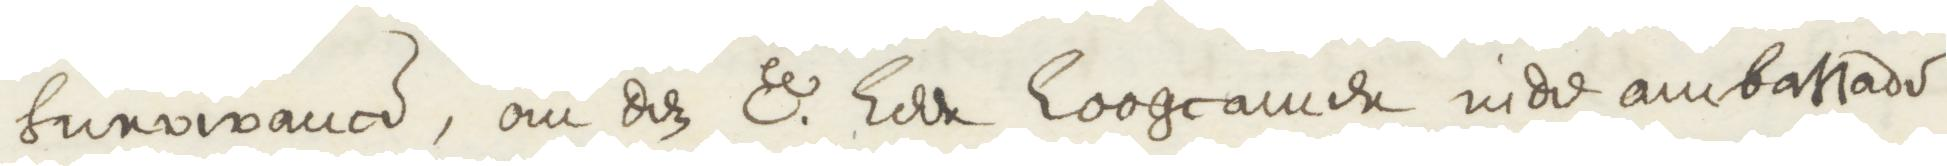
survivance, om den E. heer hoogcamer in de ambassade
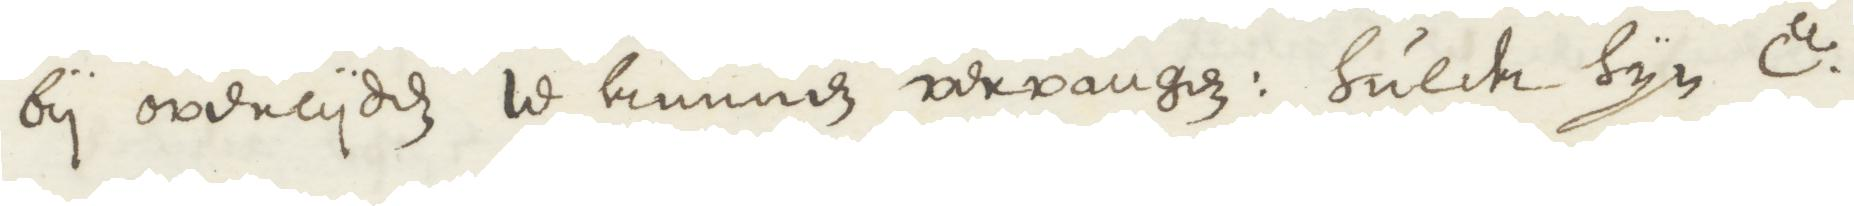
bij overlijden te kunnen vervangen: sulck sijn E.
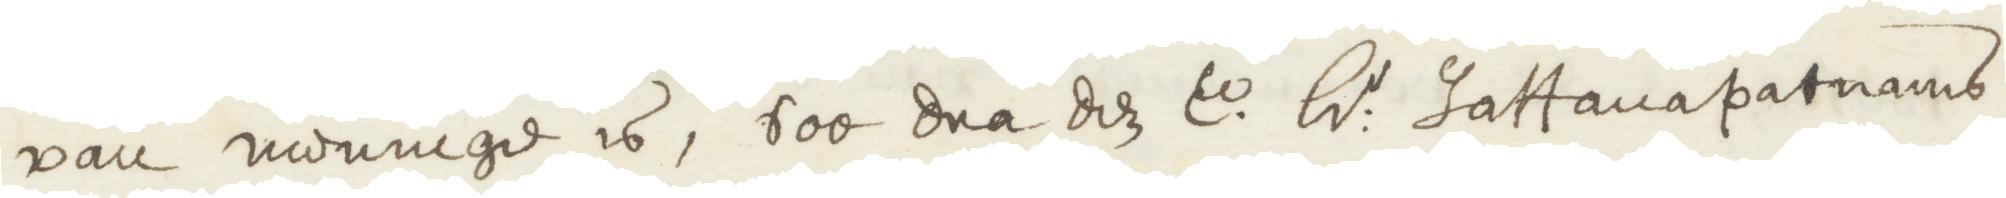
van meninge is, soo dra den E. h:r Iaffanapatnams
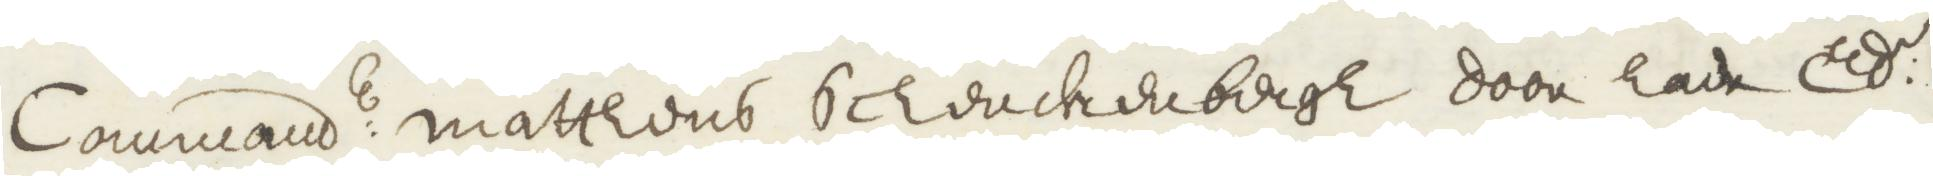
Command:r mattheus schenckenbergh door haer Ed:e
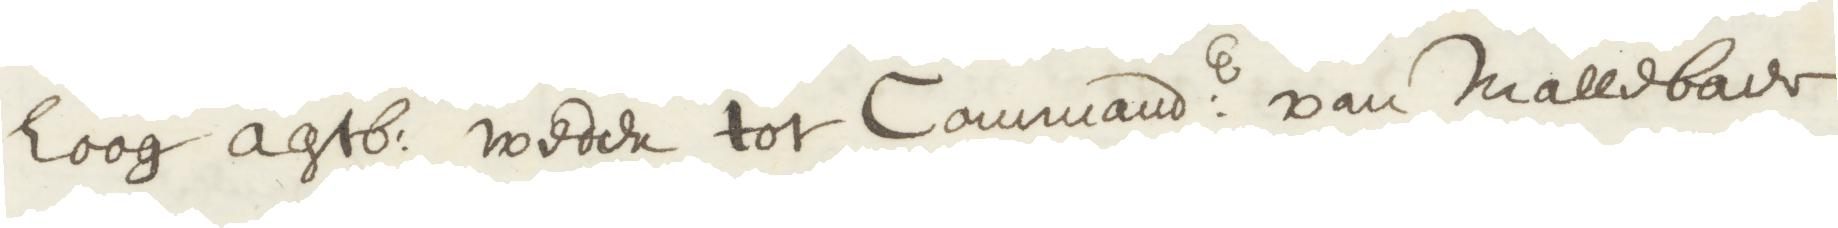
hoog agtb: weder tot Command:r van Mallebaer
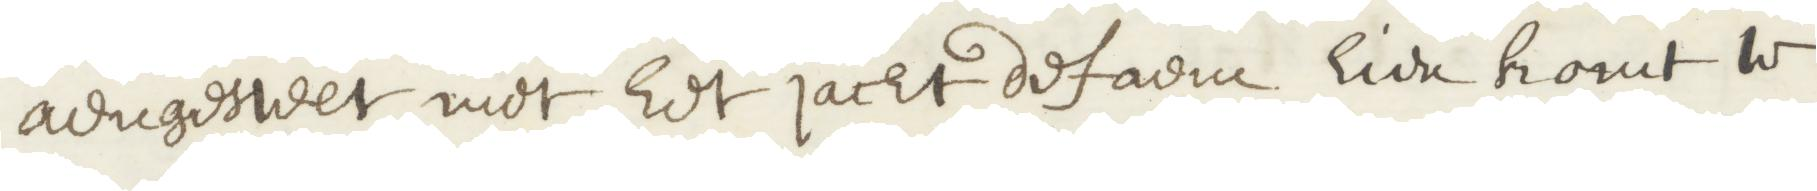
aengestelt met het jacht defaem hier komt te
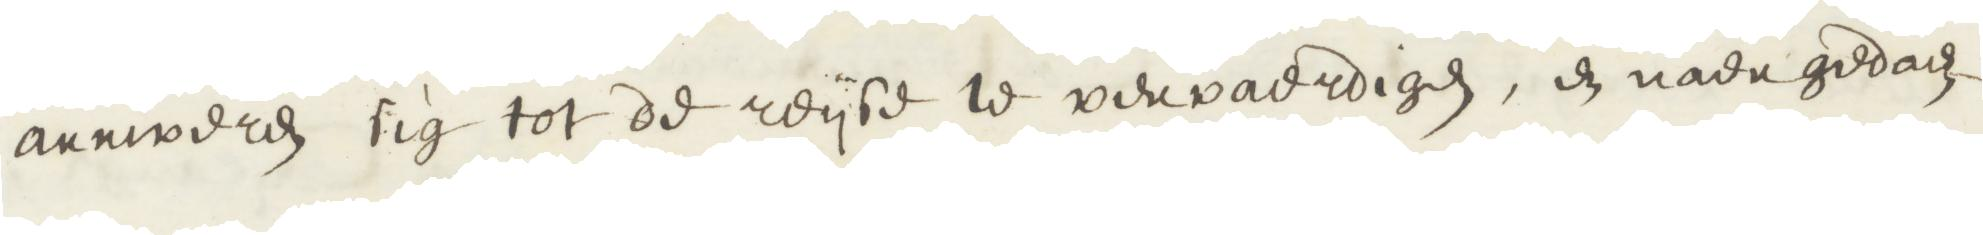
arriveren sig tot de reijse te vervaerdigen, en naer gedaen
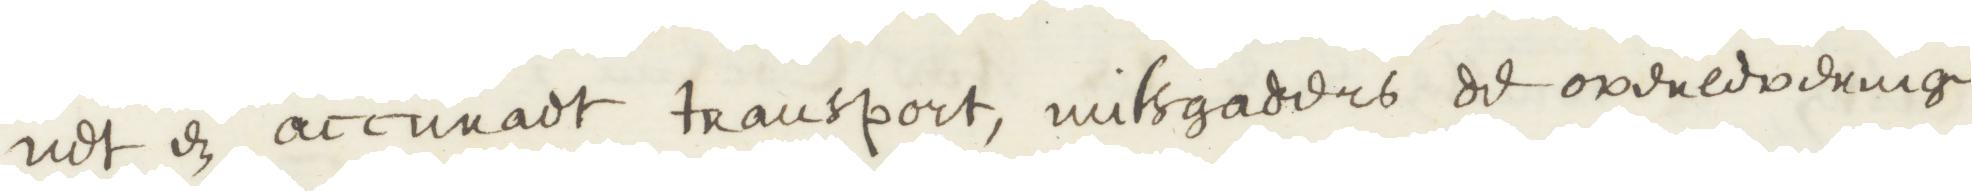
net en accuraet transport, mitsgaders de overleveringe
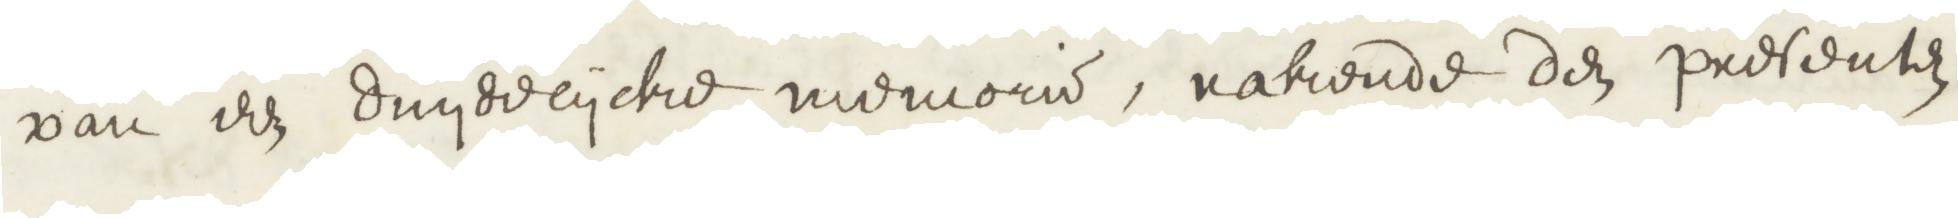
van een duijdelijcke memorie, rakende den presenten
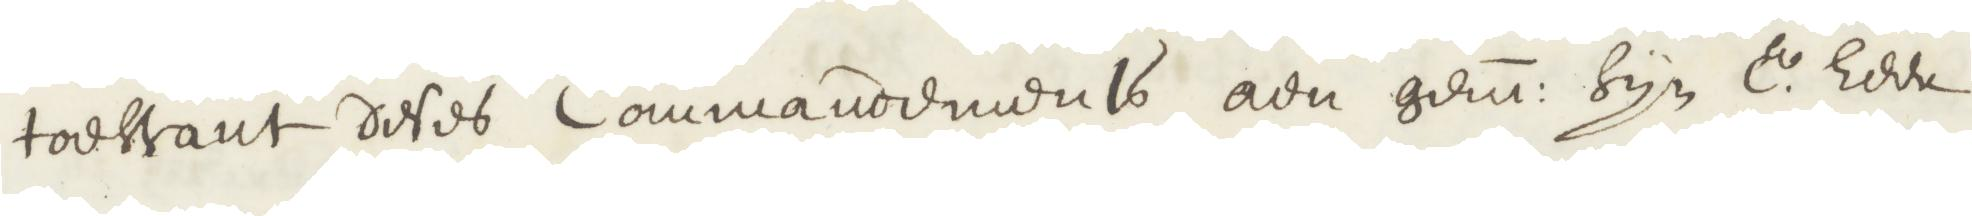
toestant deses Commandements aen gem: sijn E. heer
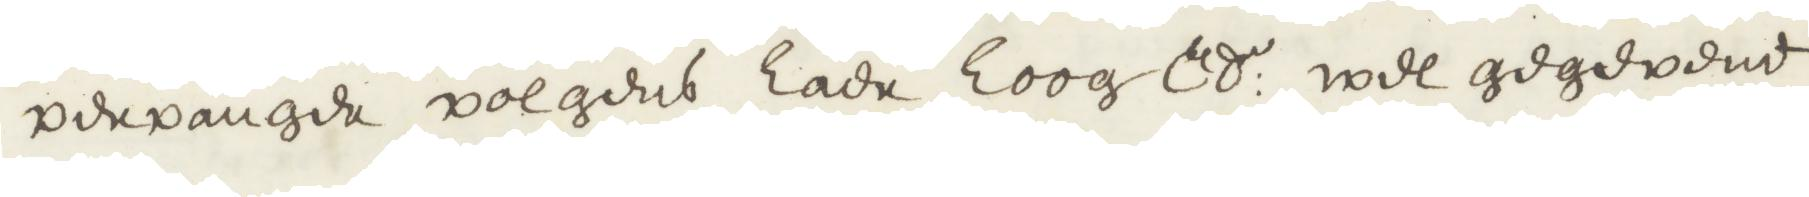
vervanger volgens haer hoog Ed:e wel gegevene
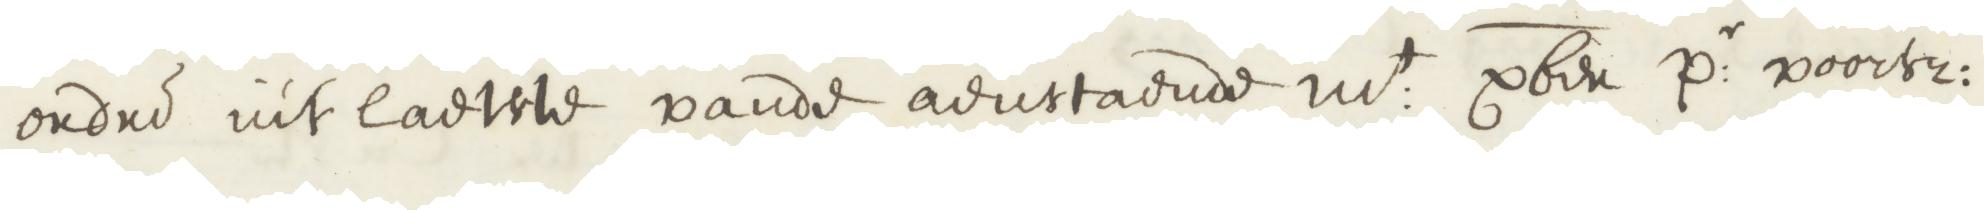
ordre in't laetste vande aenstaende m:t xber p:r voorsz:
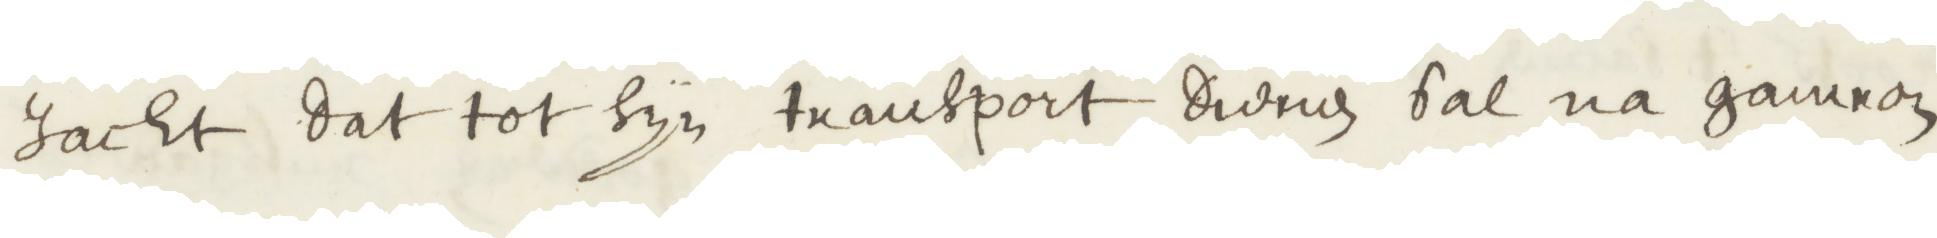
Iacht dat tot sijn transport dienen sal na gamron
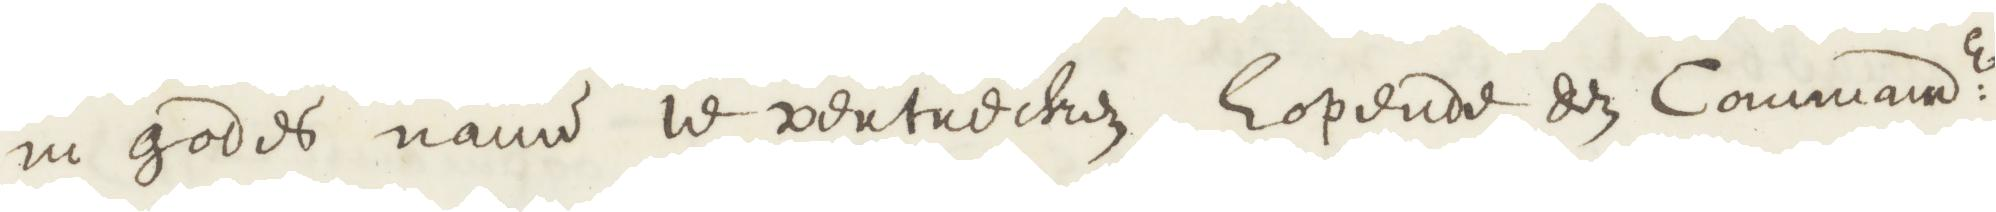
in godes name te vertrecken, hopende den Command:r
